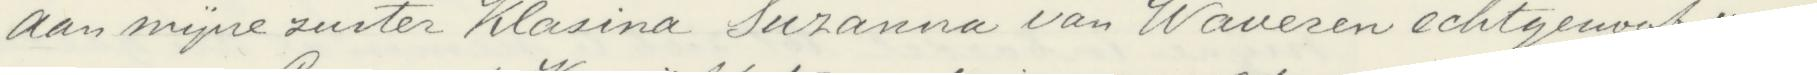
aan mijne zuster Klasina Suzanna van Waveren echtgenoot van
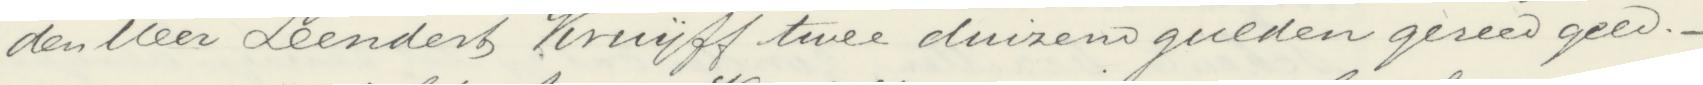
den Heer Leendert Kruijff twee duizend gulden gereed geld.
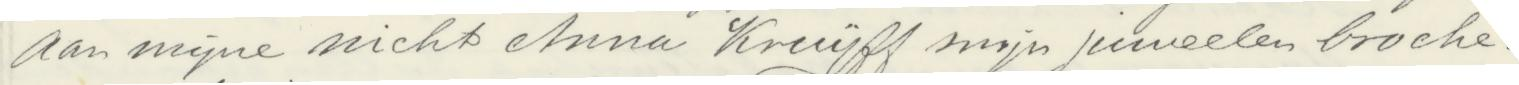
aan mijne nicht Anna Kruijff mijn juweelen broche
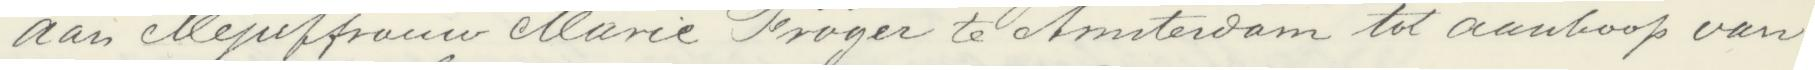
aan Mejuffrouw Marie Froger te Amsterdam tot aankoop van
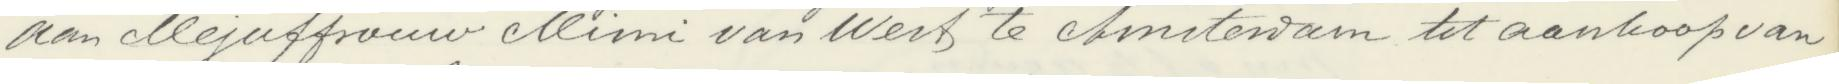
aan Mejuffrouw Mimi van Wert te Amsterdam tot aankoop van
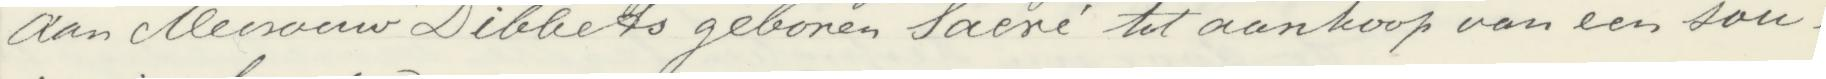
aan Mevrouw Dibbets geboren Sacré tot aankoop van een sou
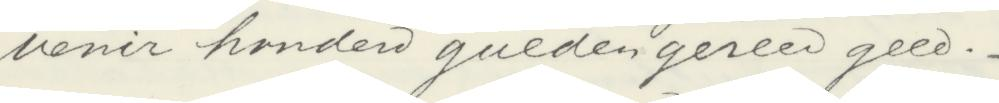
venir honderd gulden gereed geld.
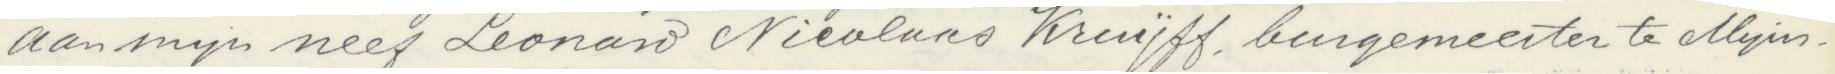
aan mijn neef Leonard Nicalaas Kruijff, burgemeester te Mijns
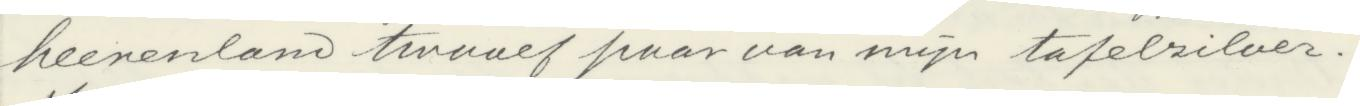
heerenland twaalf paar van mijn tafelzilver.
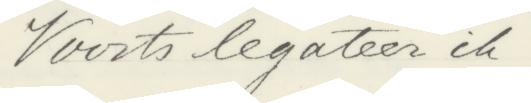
Voorts legateer ik
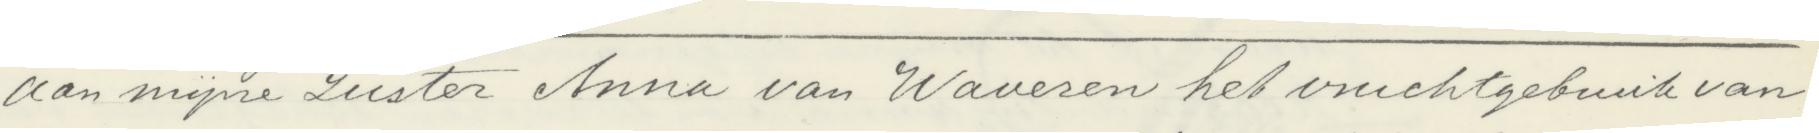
aan mijne zuster Anna van Waaeren het vruchtgebruik van
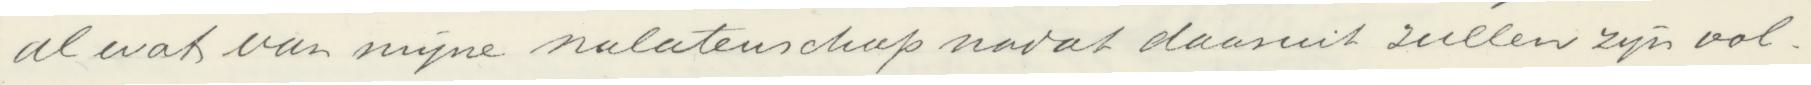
al wat van mijne nalatenschap nadat daaruit zullen zyn vol-
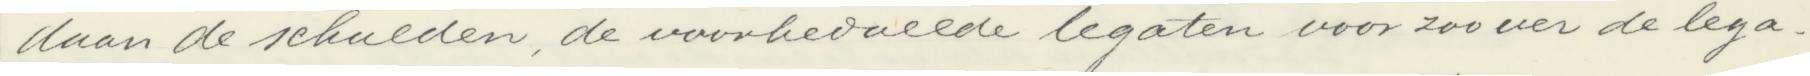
daan de schulden, de voorbedoelde legaten voor zoo ver de lega
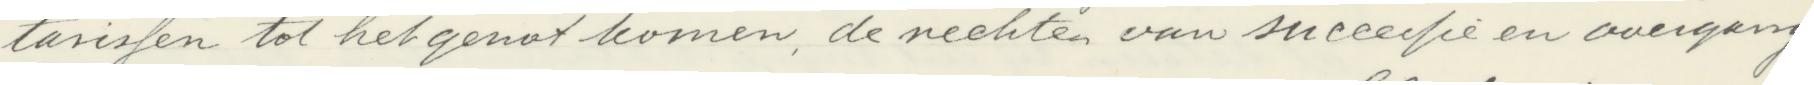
tarissen tot het genot komen, de rechten van successie en overgang
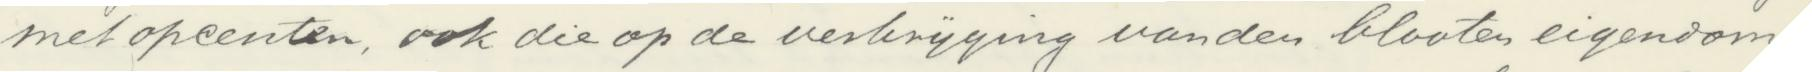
met opcenten, ook die op de verkrijging van den blooten eigendom
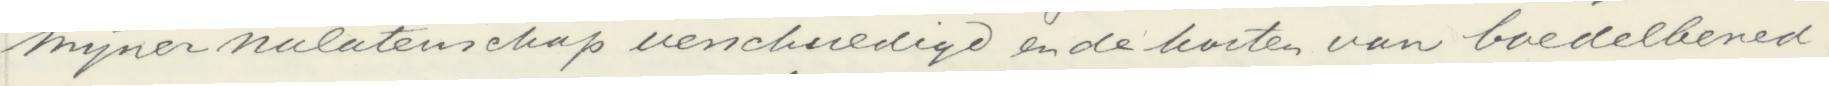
mijner nalatenschap verschuldigd en de kosten van boedelbered
